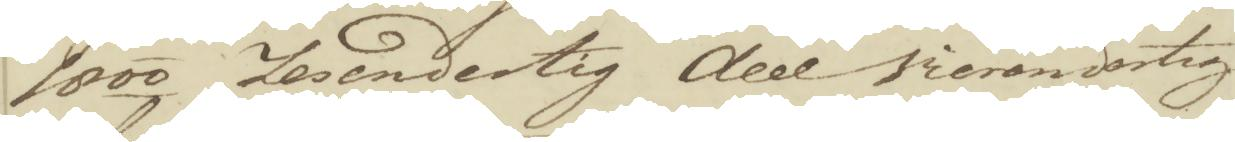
1800 zesendertig deel vierendertig
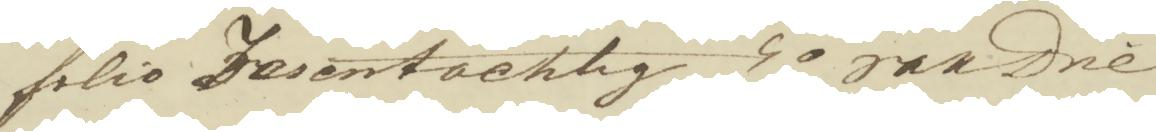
folio Zesentachtig r„o vak Drie
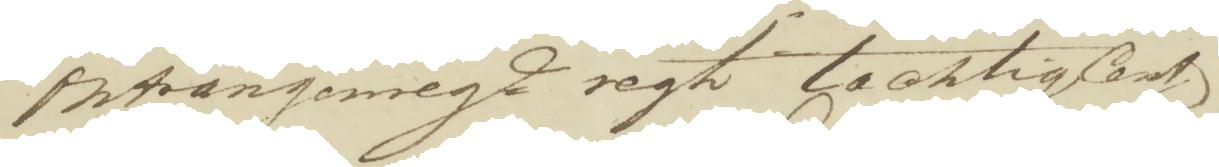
ontvangen reg=l regt tachtig Cent
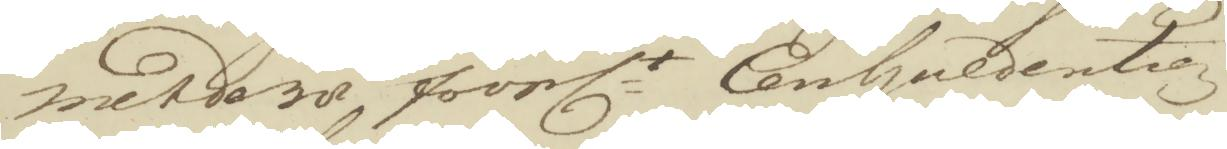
met de 38% opC=t Een Gulden tien
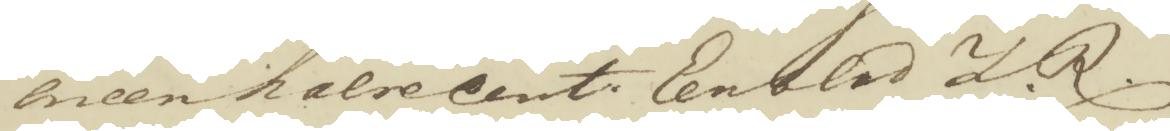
en een halve cent. Een blad Z.R.
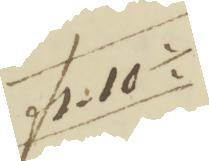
ƒ1-10½
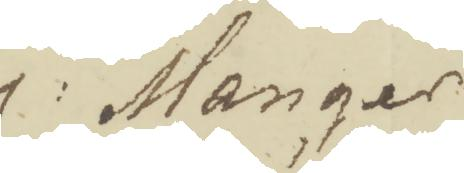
G: Manger
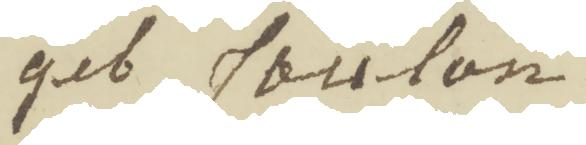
geb Coulon
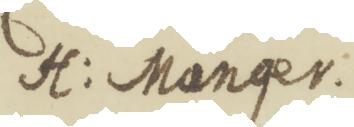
H: Manger.
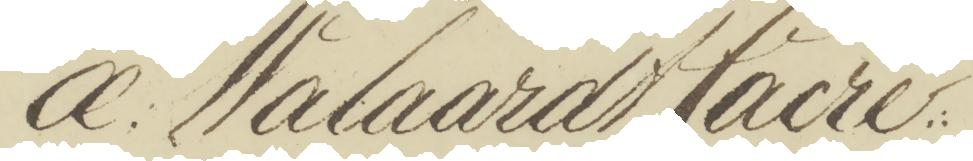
AE: Walaardt Sacre.:
